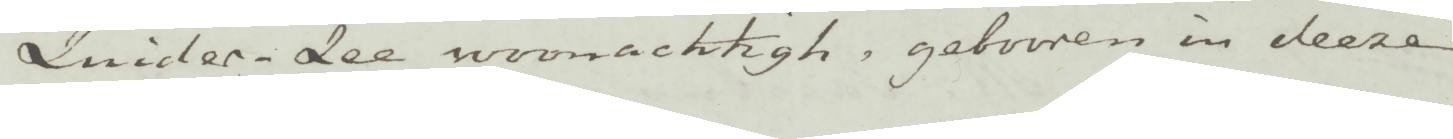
Zuider- Zee woonachtigh, gebooren in deeze
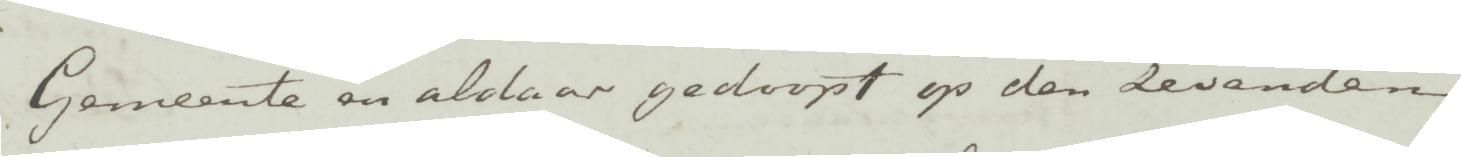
Gemeente en aldaar gedoopt op den zevenden
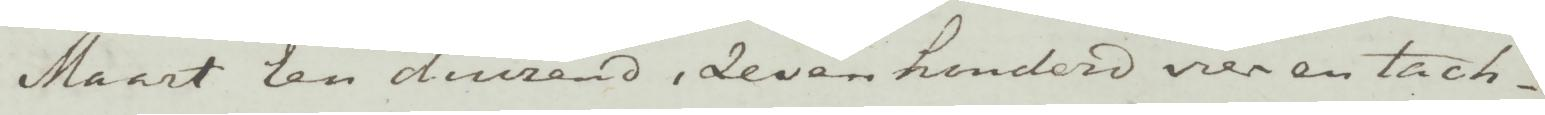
Maart Een duizend, zeven honderd vier en tach=
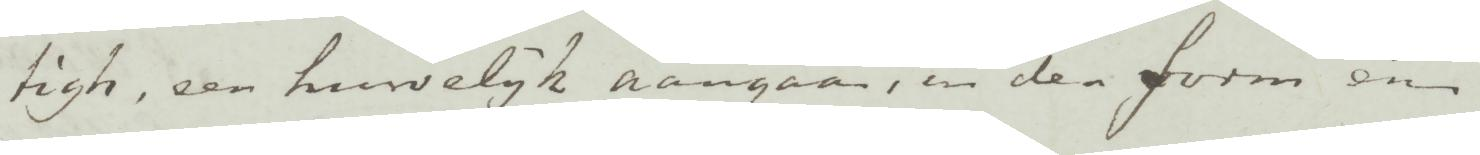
tigh, een huwelijk aangaan, in den form en
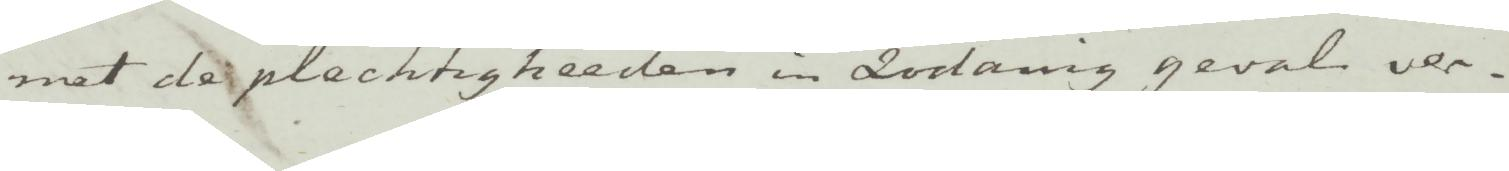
met de plechtigheeden in zodanig geval ver-
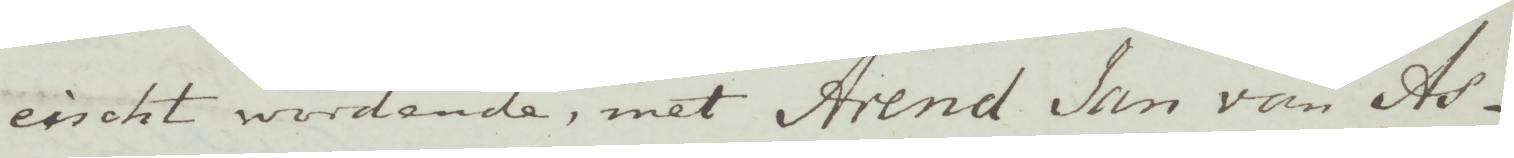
eischt wordende, met Arend Ian van As-
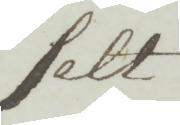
selt
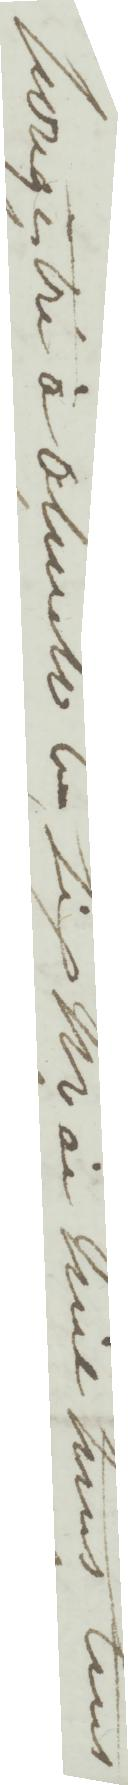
Inregistré à almelo le six Mai mil huit Cent
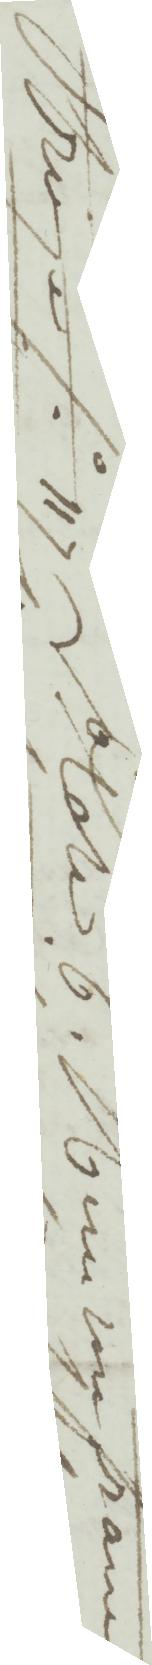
treize f:o117 V:o vak 6. Bun un franc
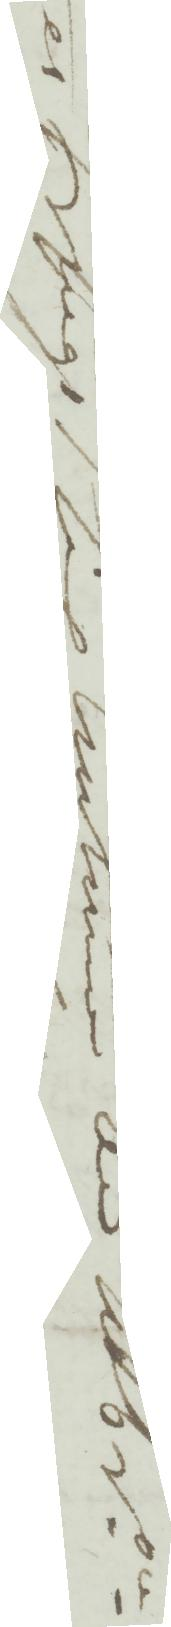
et vingt six centimes de 40 v:o
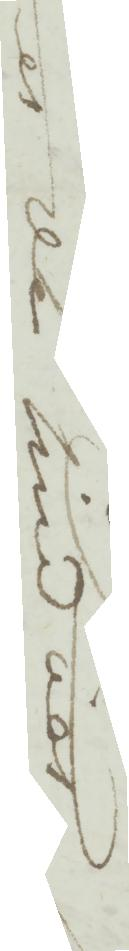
et de hin oos. ƒ.
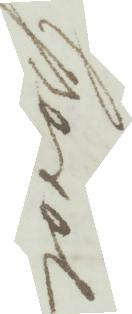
Grevol
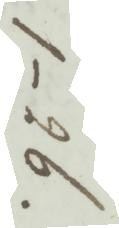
1— 26.
